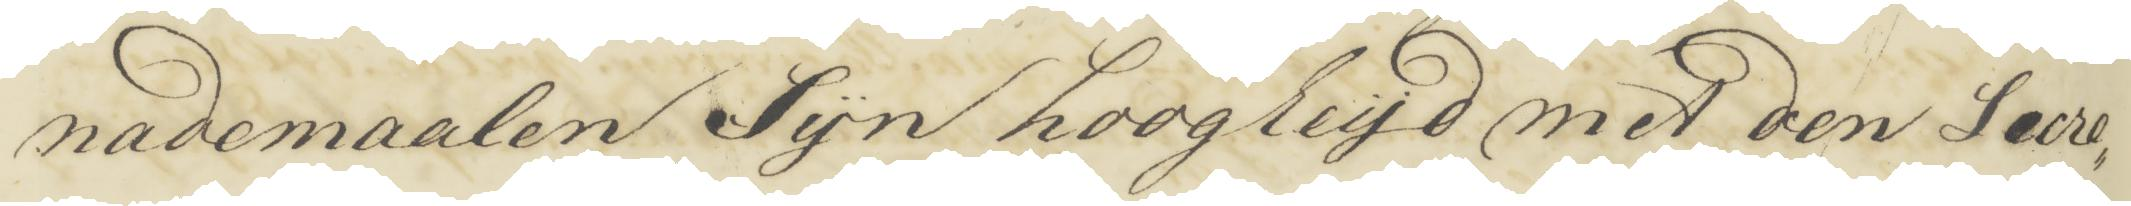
nademaalen sijn hoogheijd met den secre„
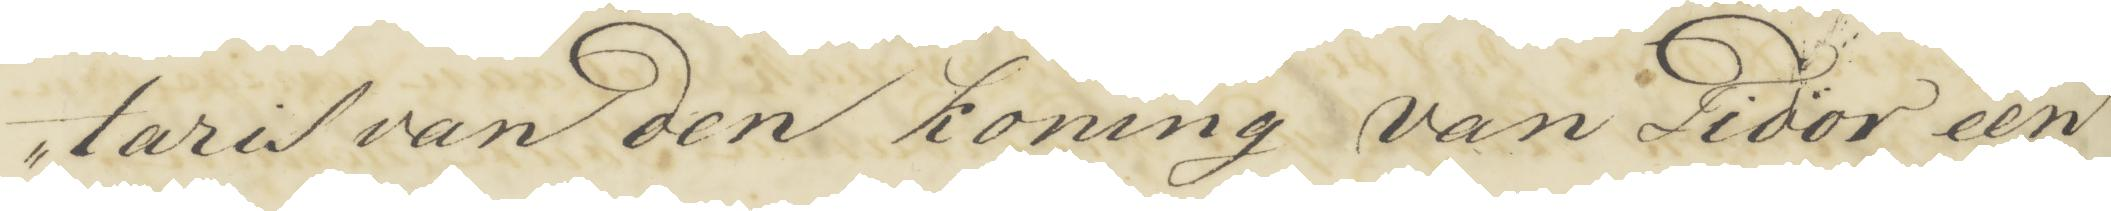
„taris van den koning van Tidor een
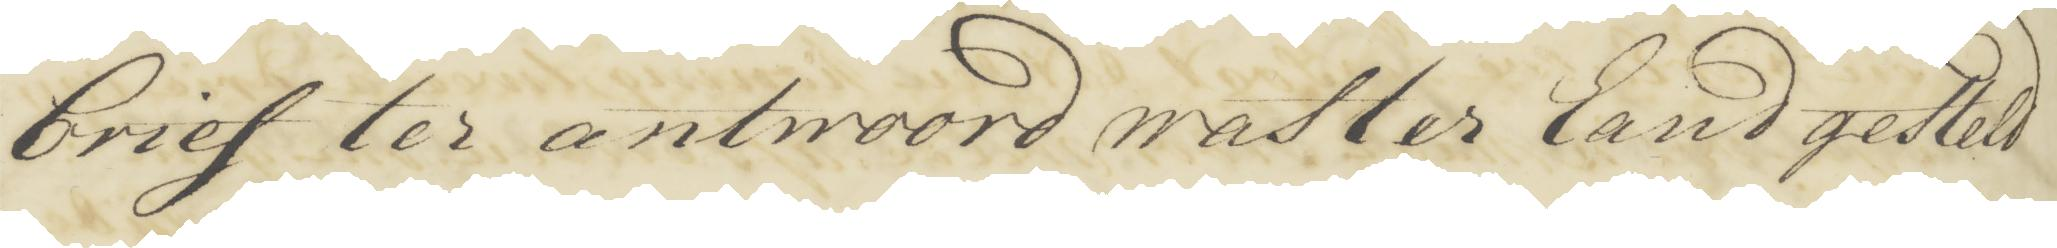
brief ter antwoord was ter hand gesteld
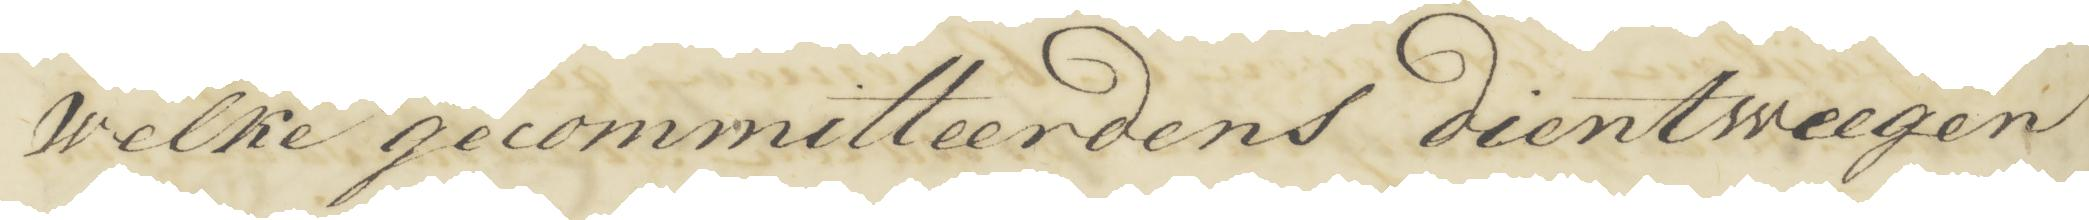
welke gecommitteerdens dientweegen
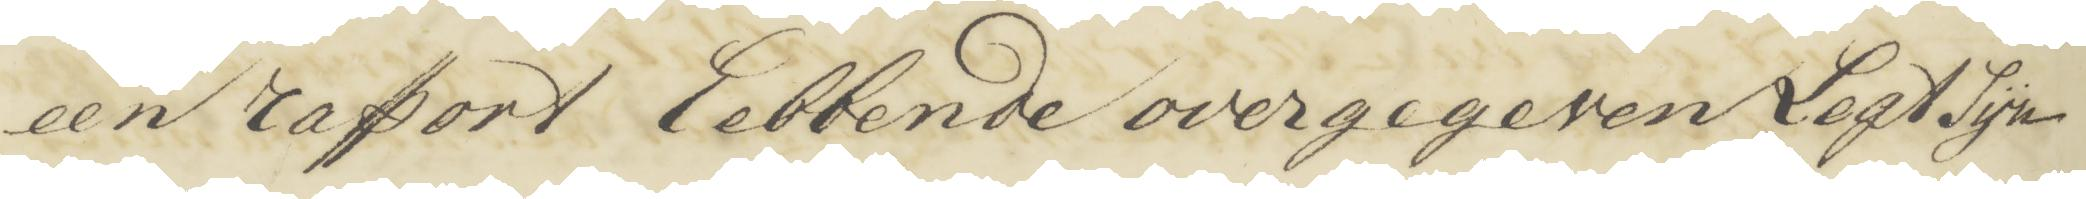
een rapport hebbende overgegeven Legt sijn
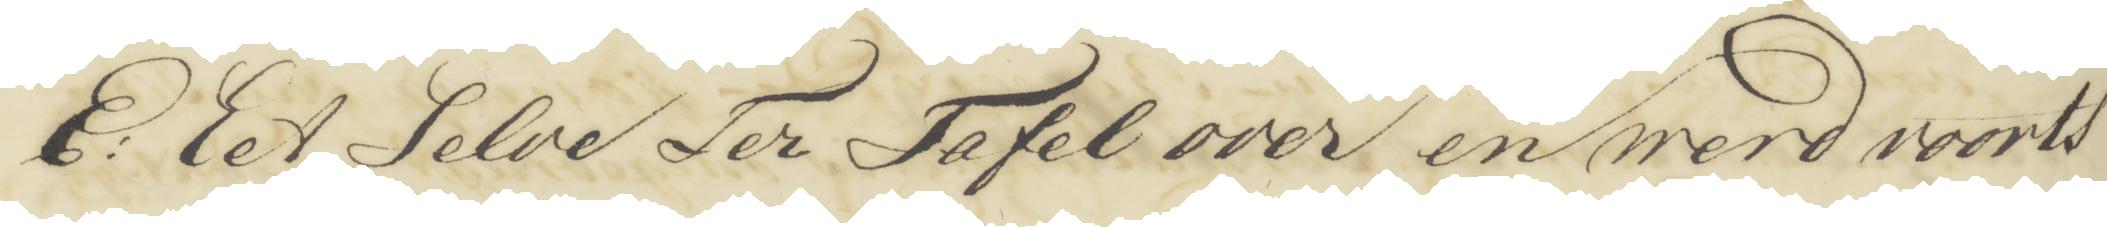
E: het selve Ter Tafel over en werd voorts
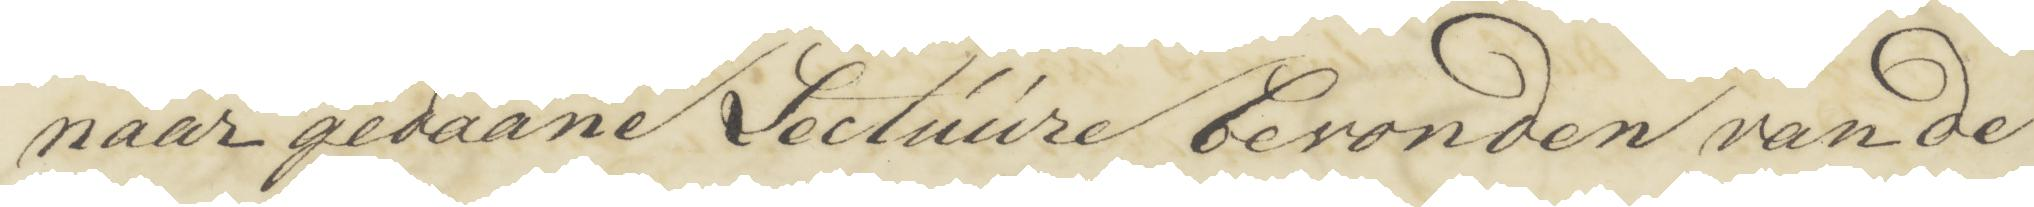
naar gedaane Lectuure bevonden van de
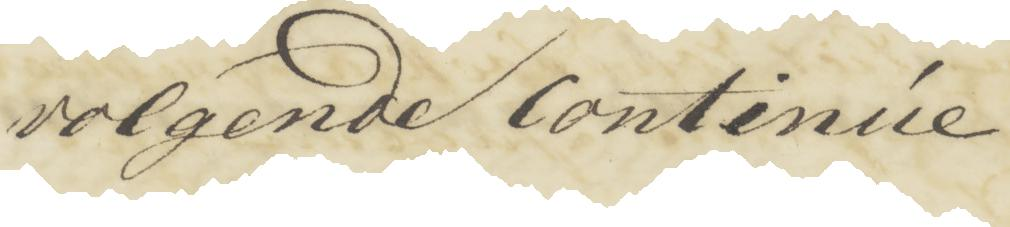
volgende continue
